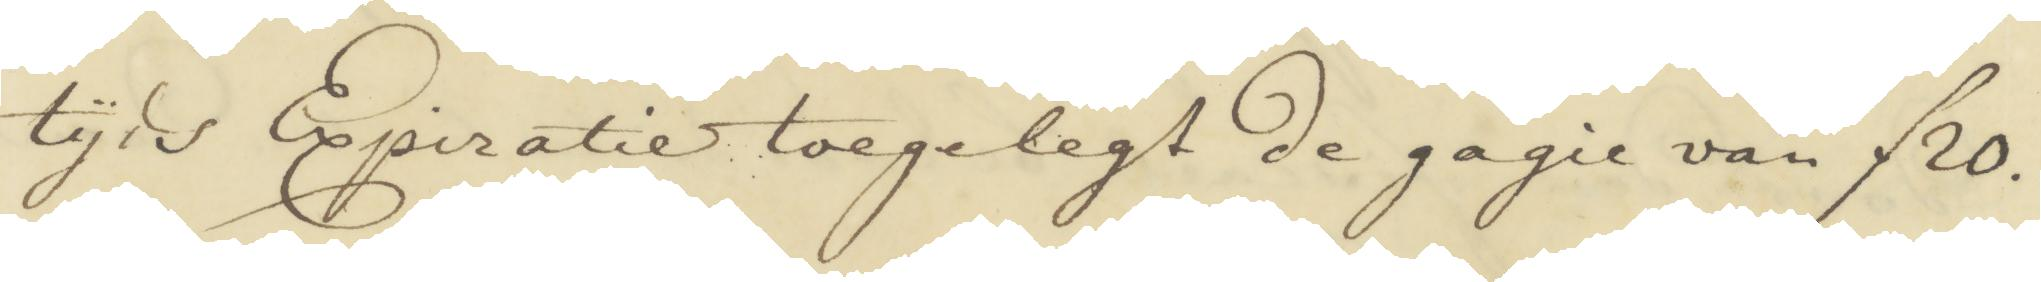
tijds Expiratie toegelegt de gagie van ƒ20.
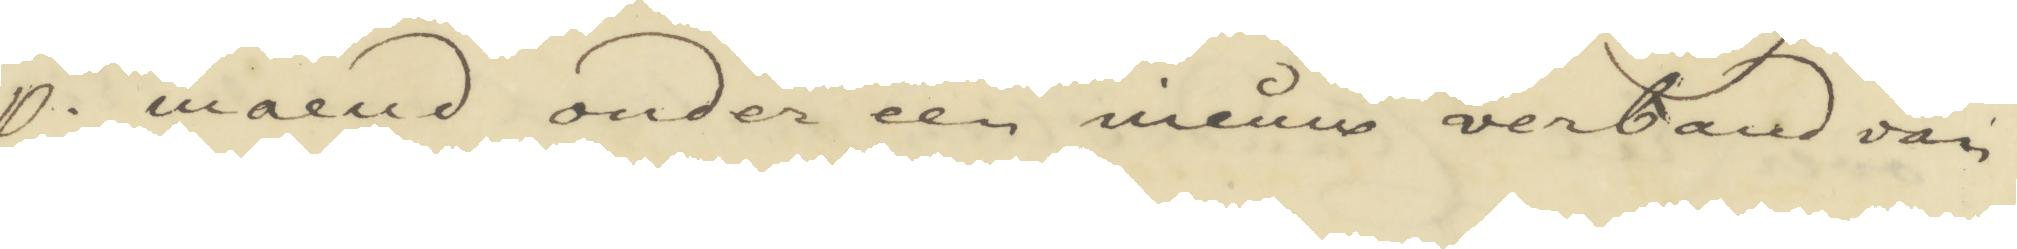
p.r maend onder een nieuw verband van
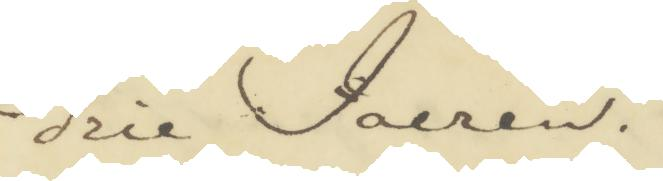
drie Iaeren.
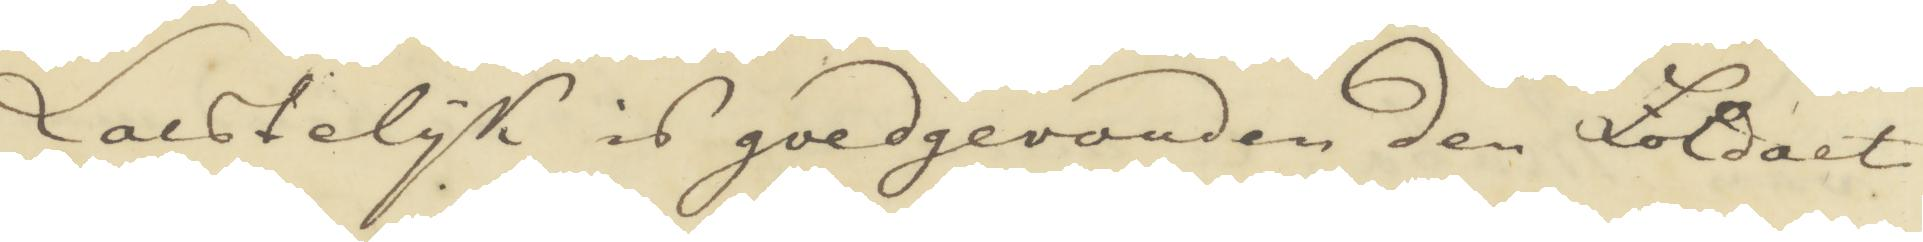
Laestelijk is goedgevonden den zoldaet
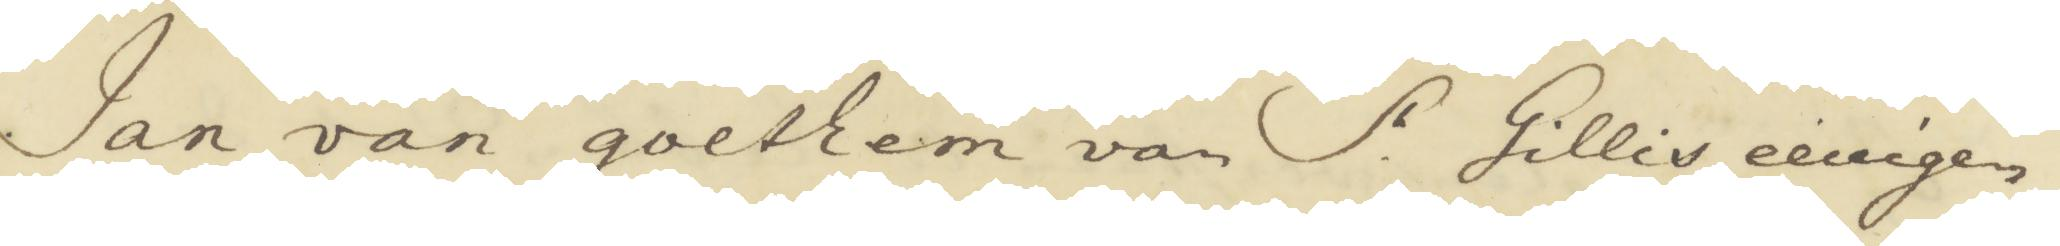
Ian van goethem van S.t Gillis eenigen
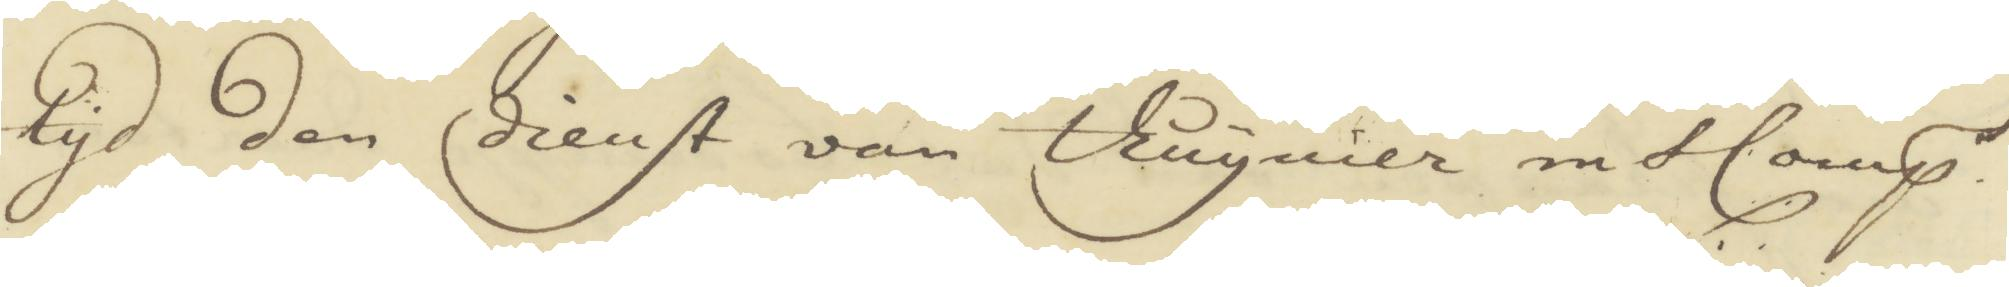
tijd den dienst van thuijnier in s Comp.s
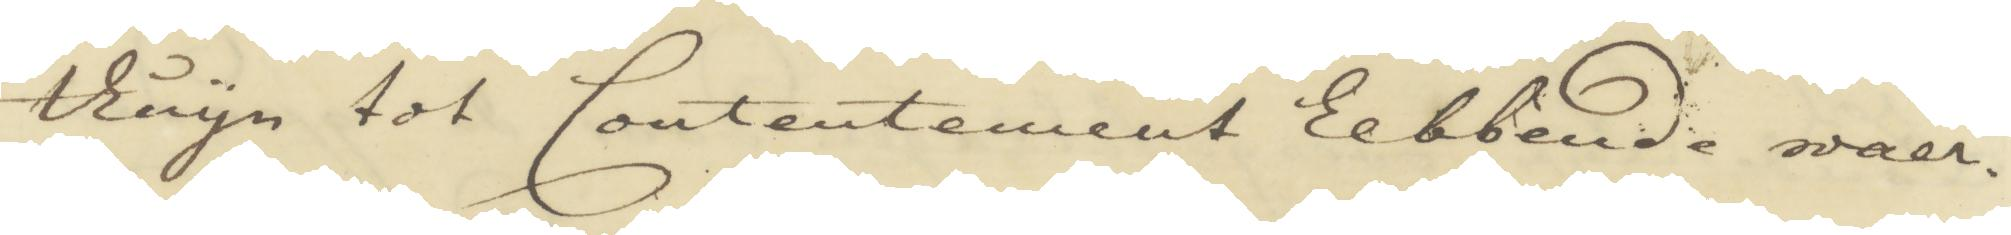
thuijn tot Contentement hebbende waar.
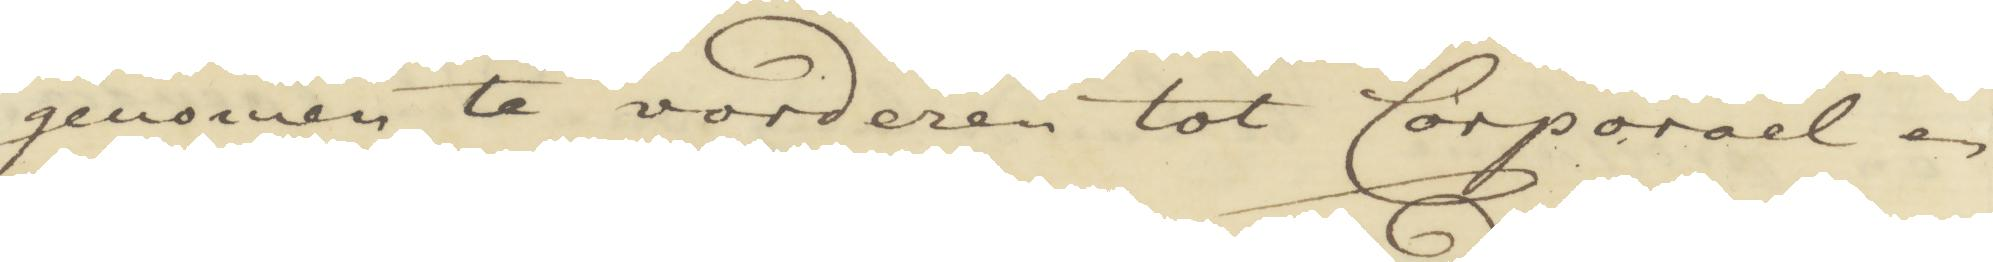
genomen te vorderen tot Corporael en
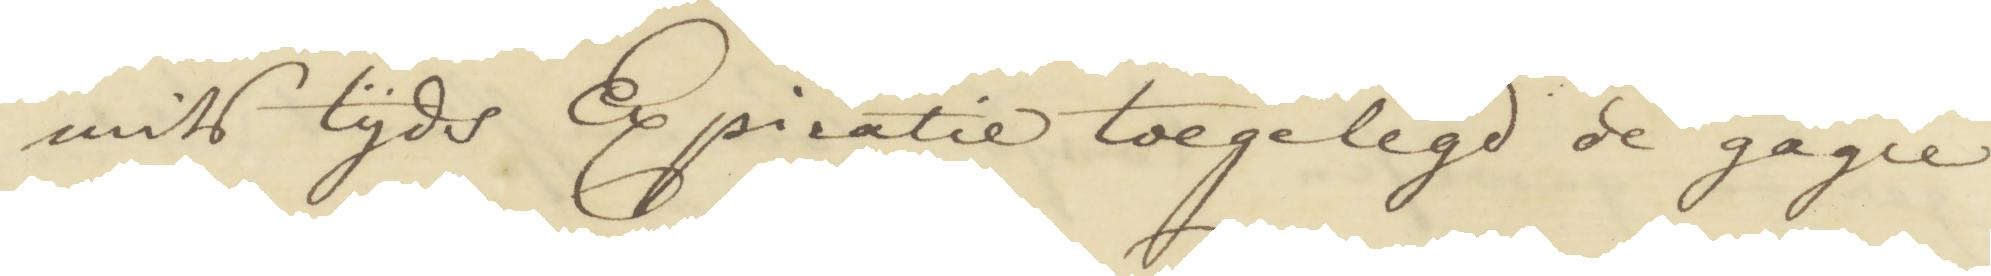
mits tijds Expiratie toegelegd de gagie
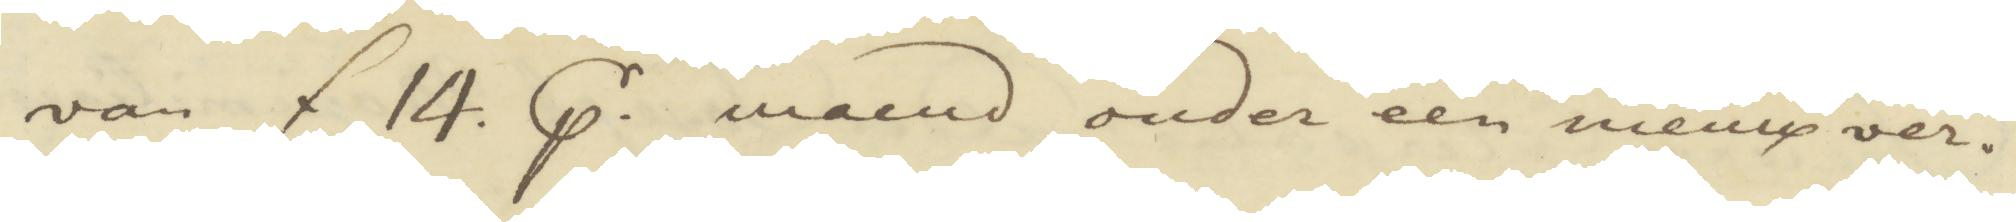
van ƒ14. p.r maend onder een nieuw ver„
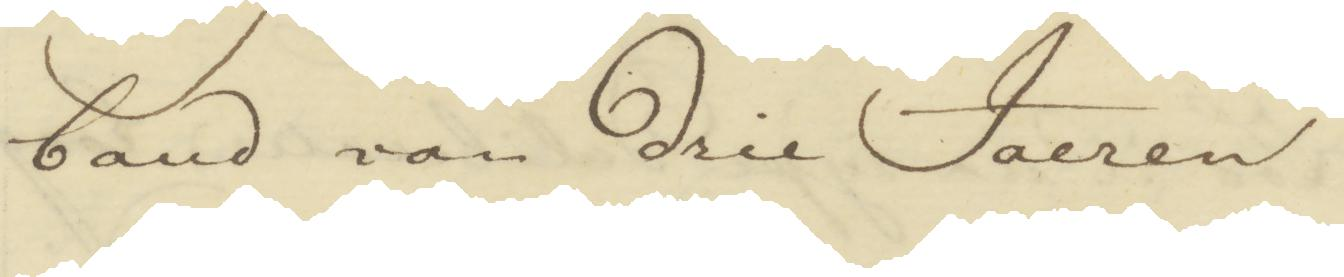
band van drie Iaeren
